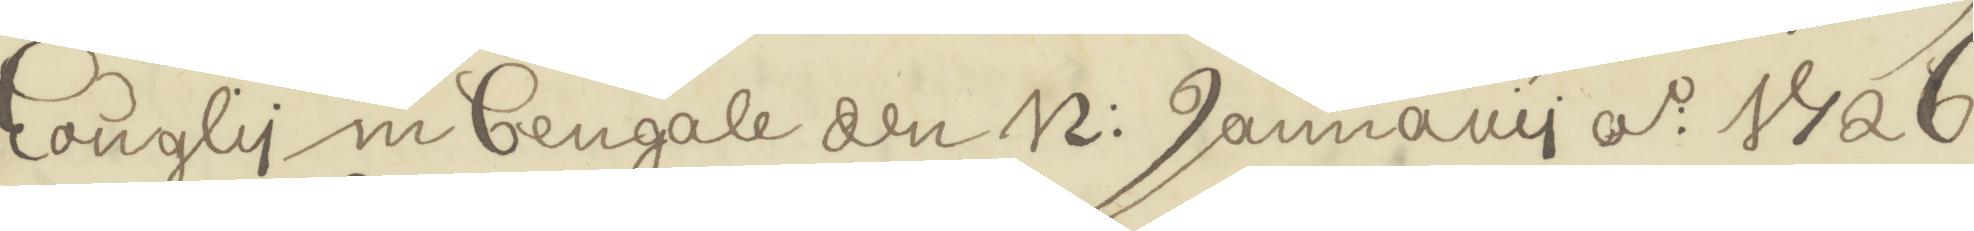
houglij in bengale den 12: Januarij a:o 1726
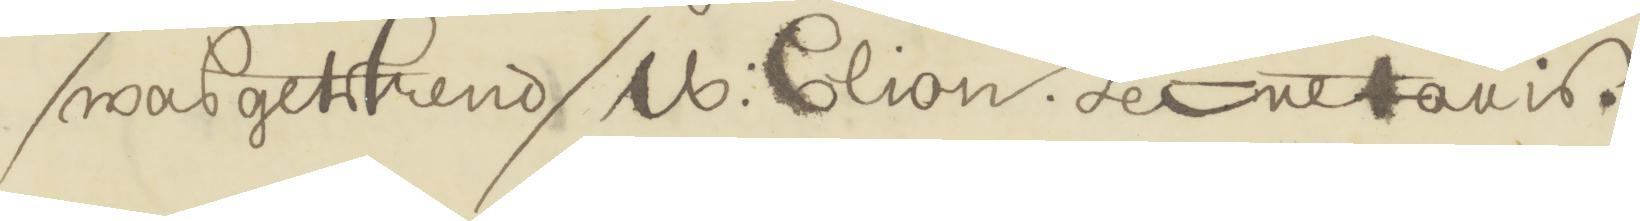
/was getekend/ u: E lion. secretaris.
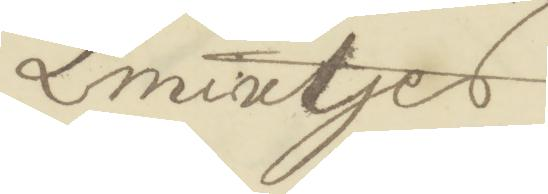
Amirtjes
